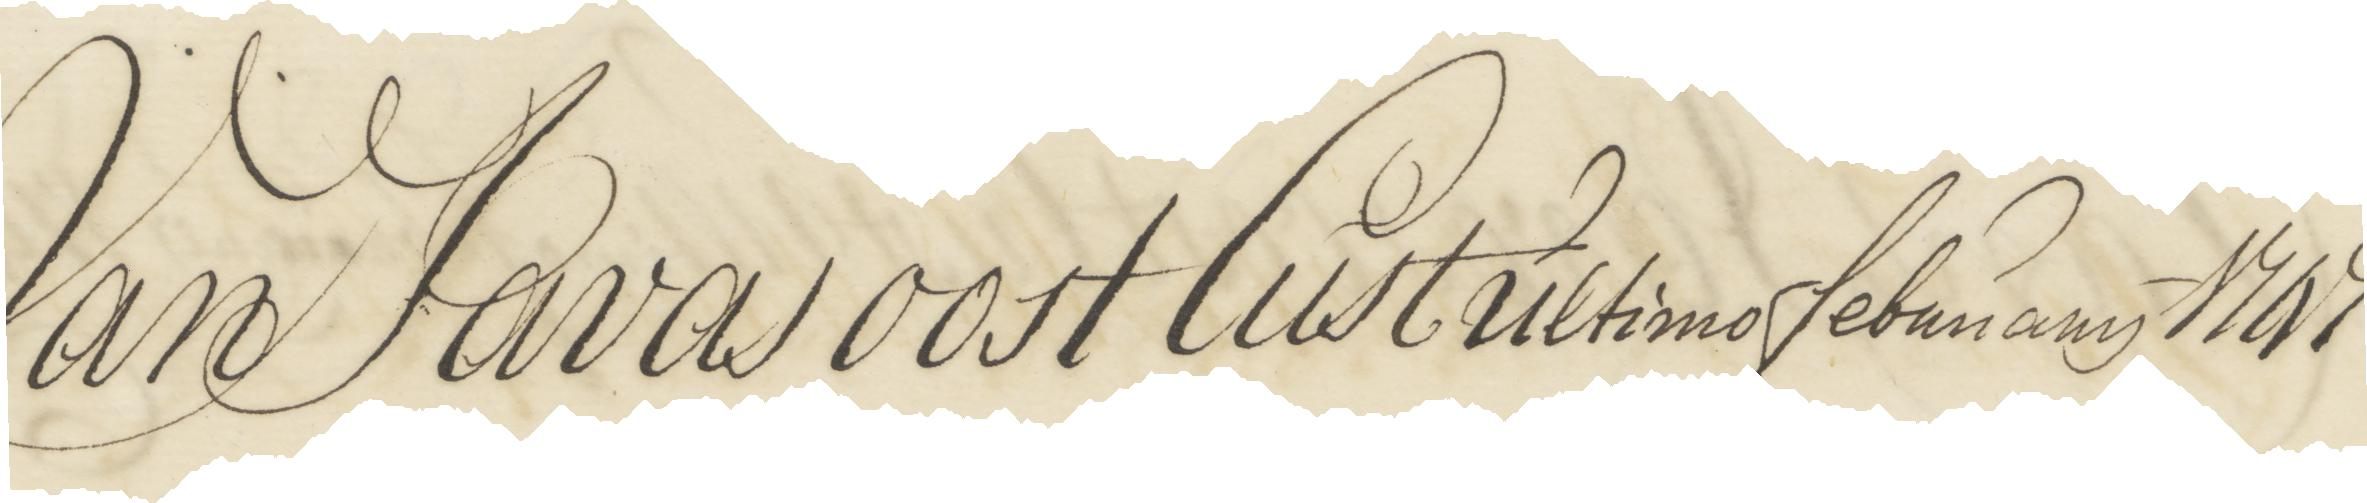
Van Javas oost Cust ultimo februarij 1747
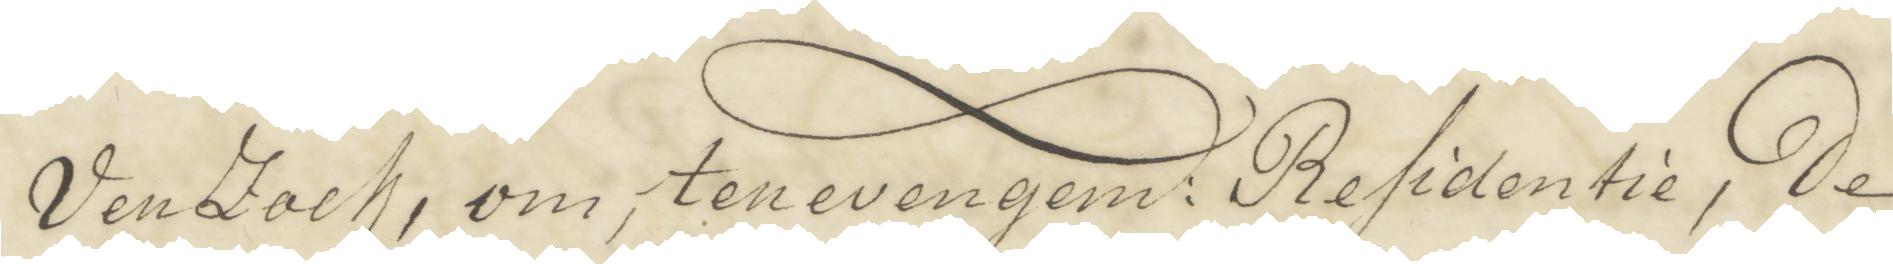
verzoek, om, ten evengem: Residentie, de
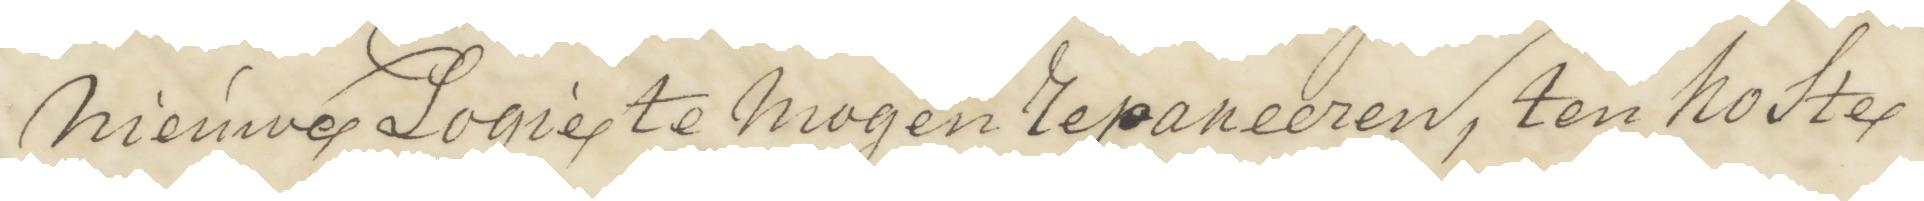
nieuwe Logie te mogen repareeren, ten koste
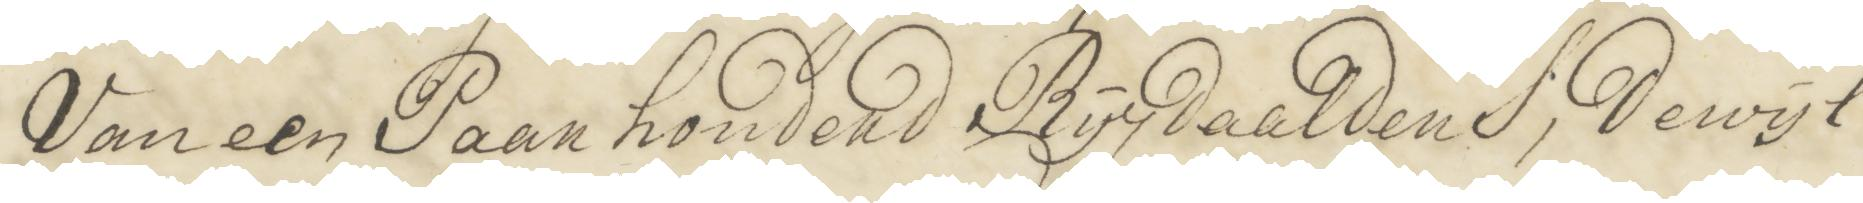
Van een Paar honderd Rijxdaaldens; dewijl
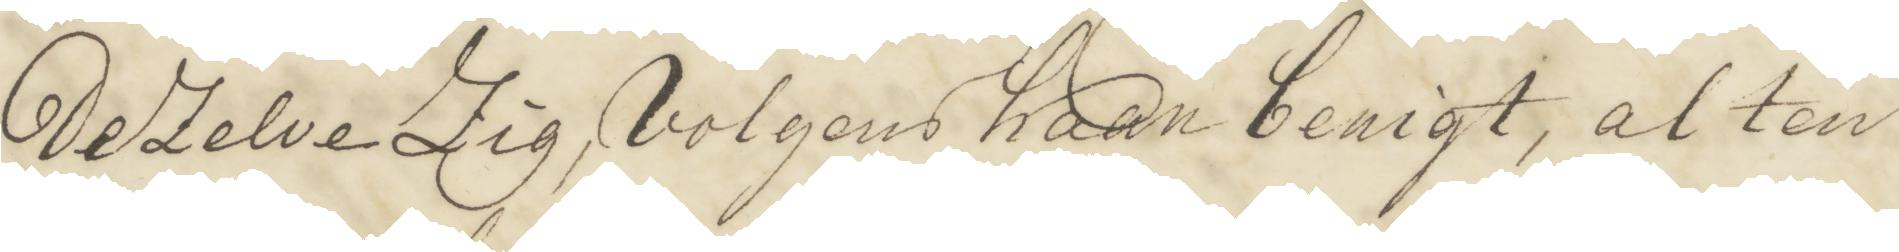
dezelve zig, volgens haar berigt, al ten
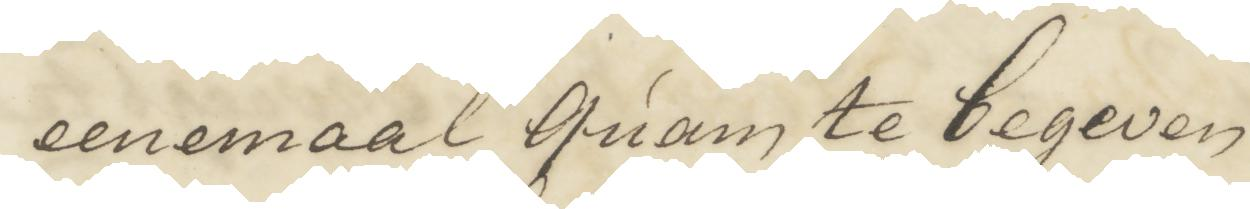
eenemaal quam te begeven
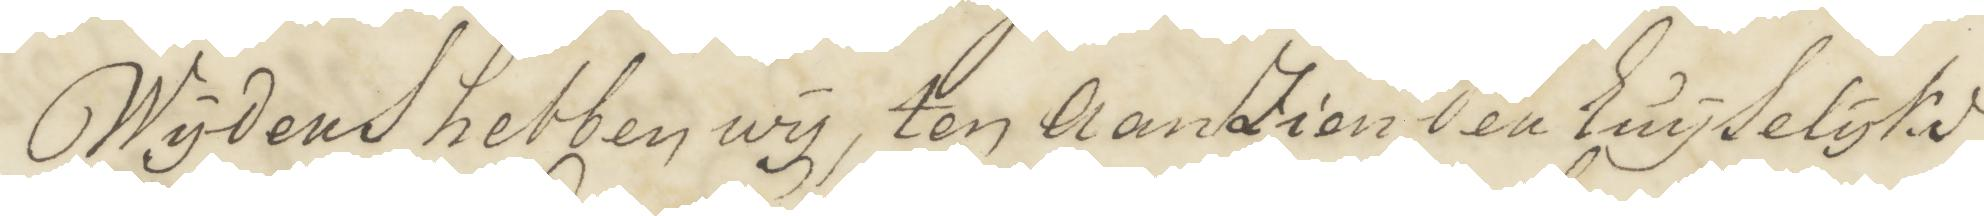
Wijders hebben wij, ten aanzien der huijselijke
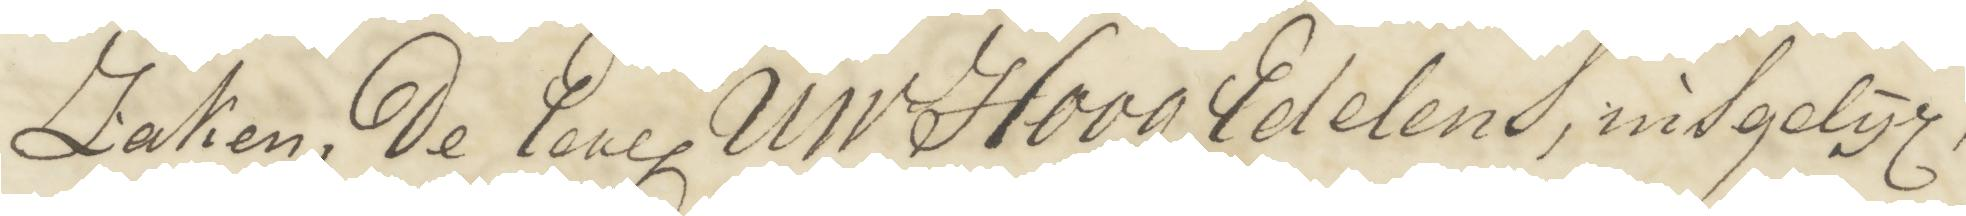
zaken, de Eere uw Hoog Edelens, insgelijx
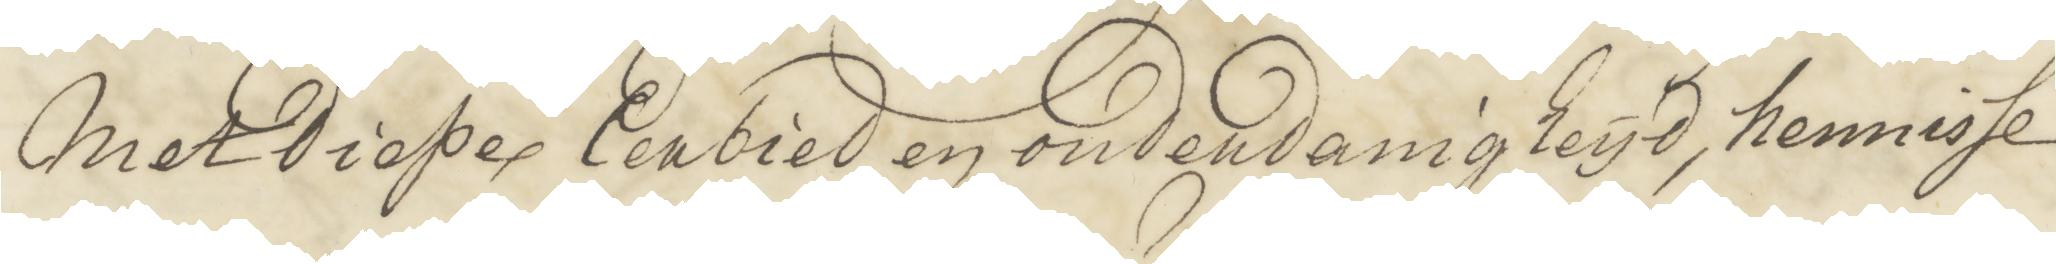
met diepe Eerbied en onderdanigheijd, kennisse
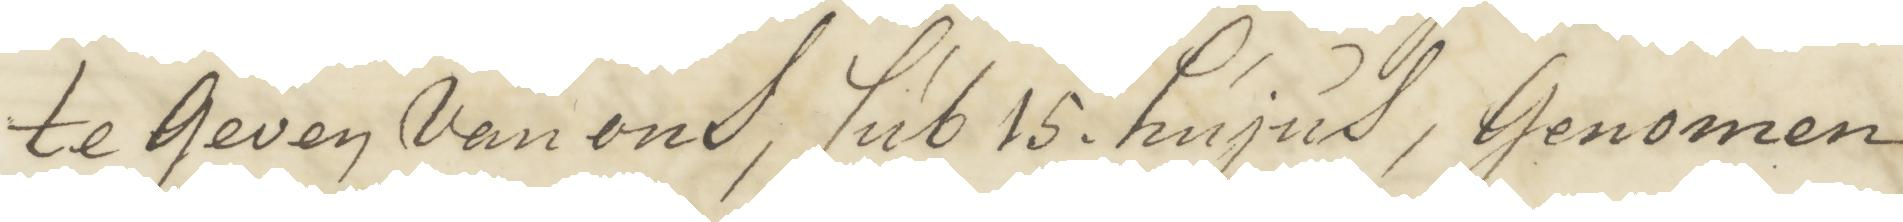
te geven van ons, sub 15.' hujus, genomen
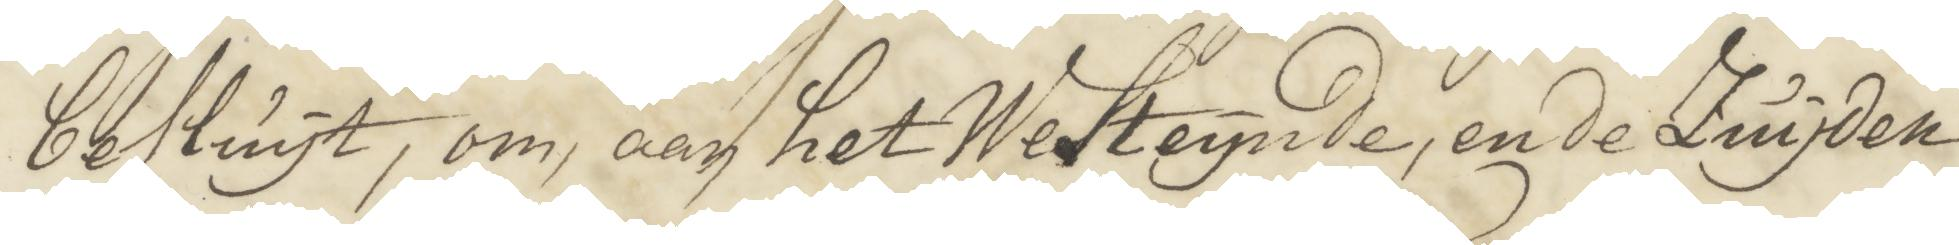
besluijt, om, aan het Westeijnde, ende Zuijden
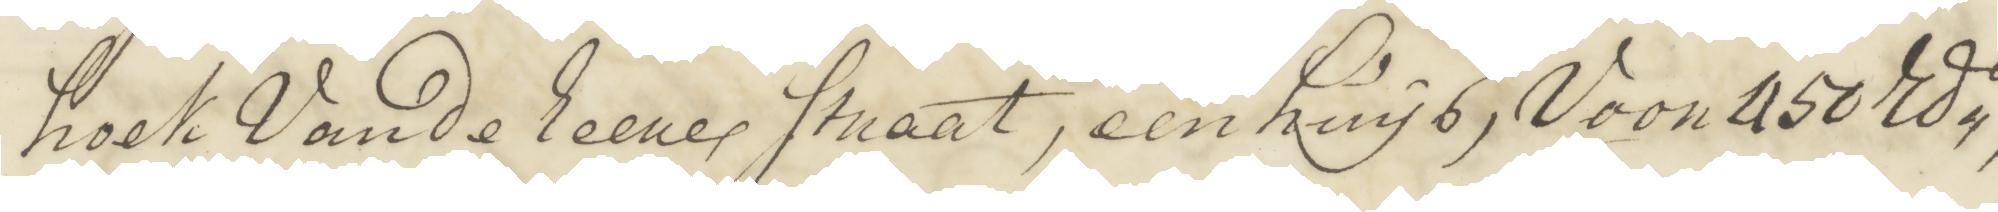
hoek van de heere straat, een huijs, voor 450 rd„s,
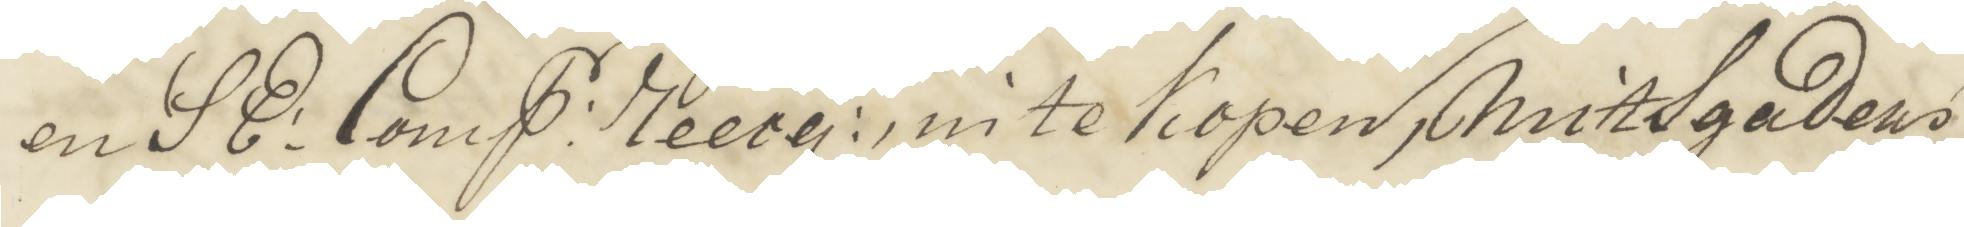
en 'SE: Comp:s reecq:, in te kopen, mitsgaders
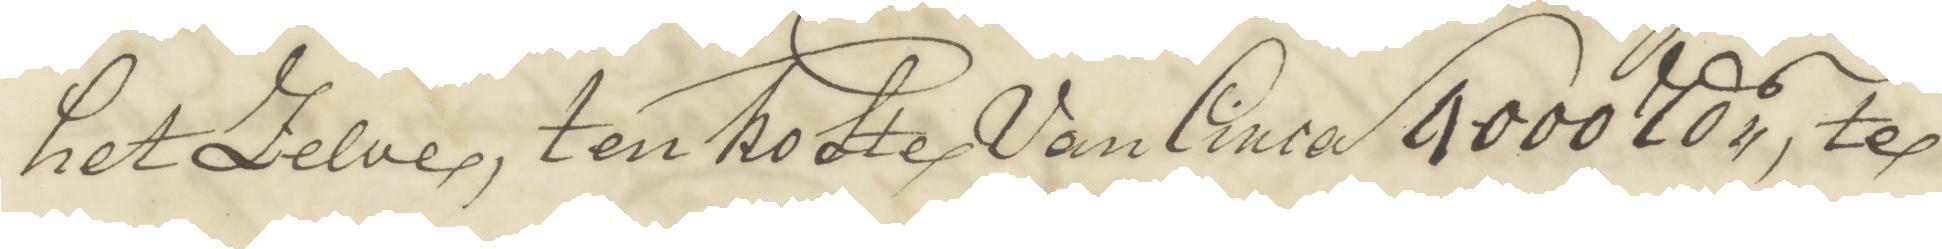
het zelve, ten koste van Circa 4000 rd„s, te
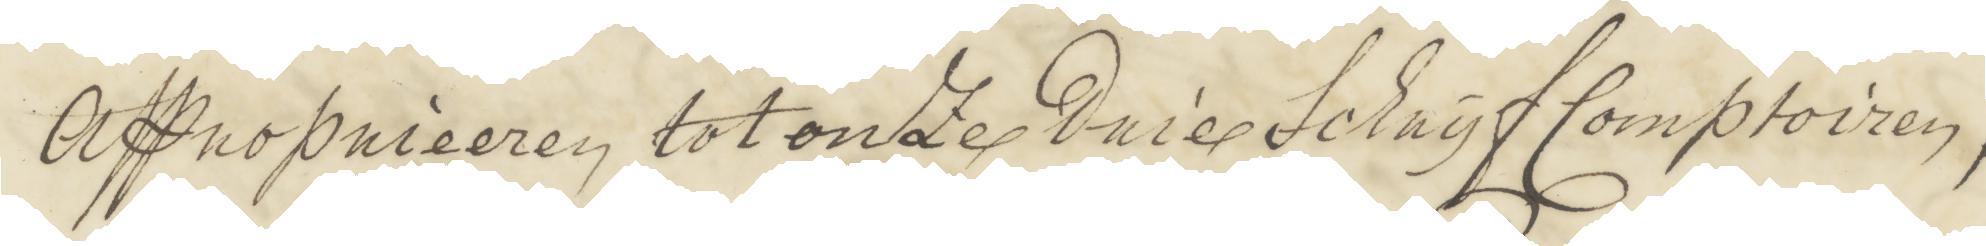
approprieeren tot onze drie schrijf Comptoiren
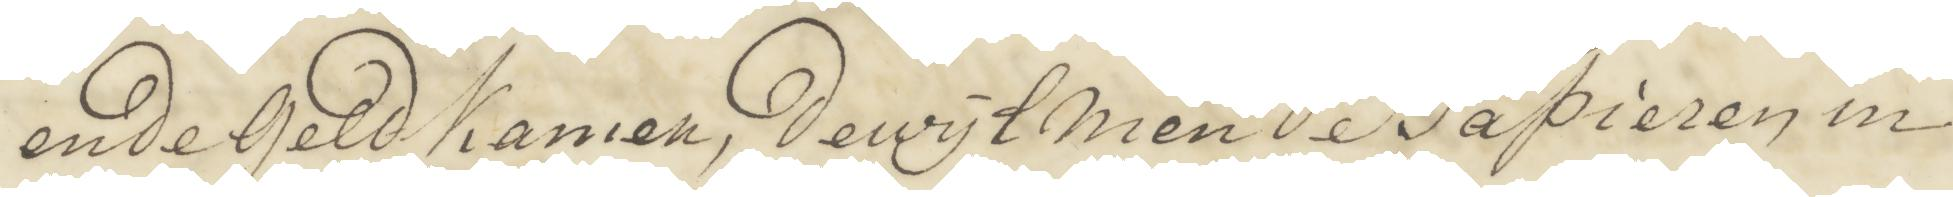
ende geldkamer, dewijl men de papieren in
